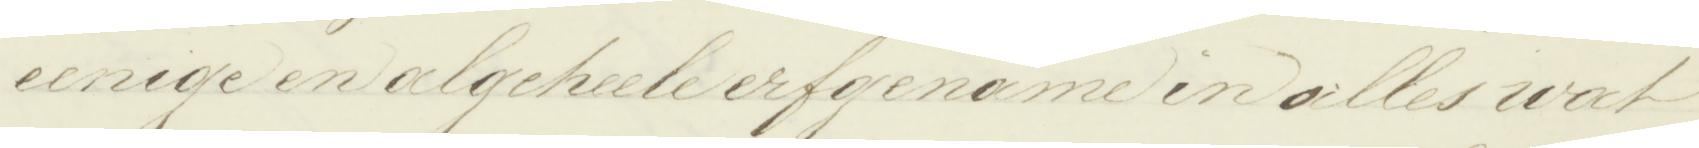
eenige en algeheele erfgename in alles wat
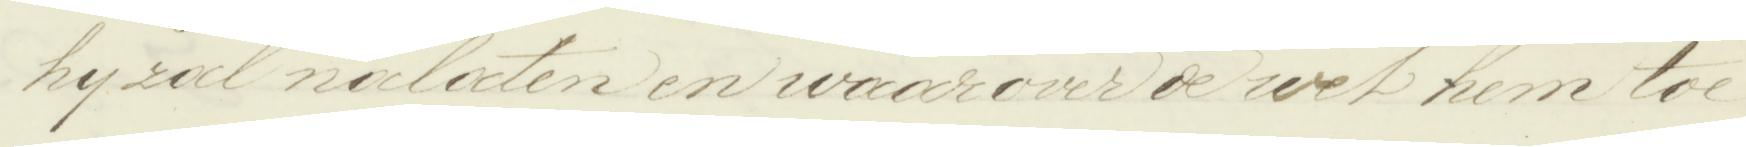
hy zal nalaten en waarover de wet hem toe
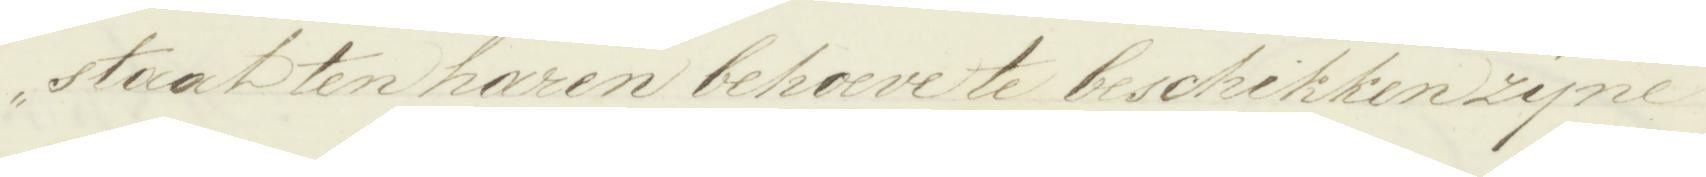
„staat ten haren behoeve te beschikken zijne
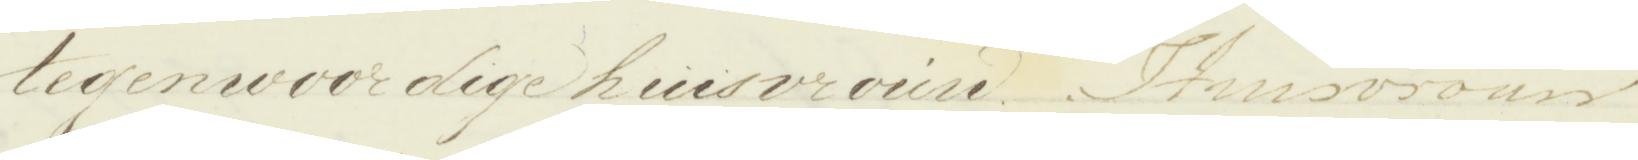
tegenwoordige huisvrouw Huisvrouw
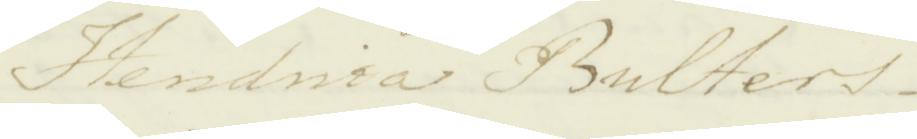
Hendrica Bulters
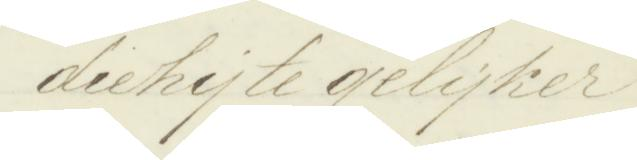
die hij te gelijker
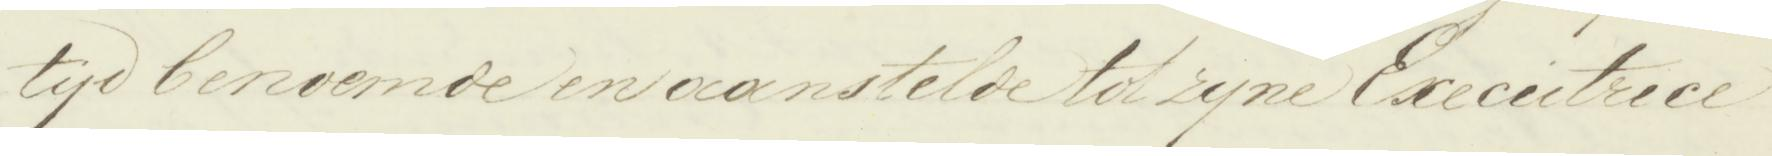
tijd benoemde en aanstelde tot zijne Executrice
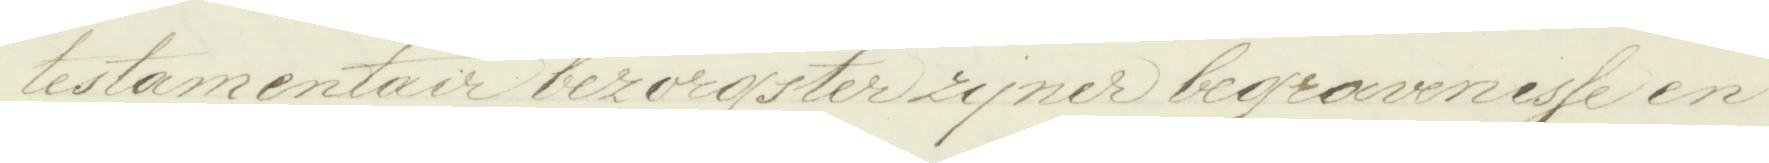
testamentair bezorgster zijner begravenisse en
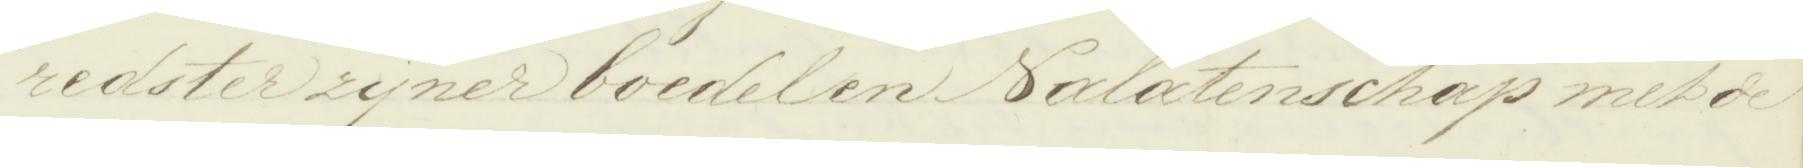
redster zijner boedel en Nalatenschap met de
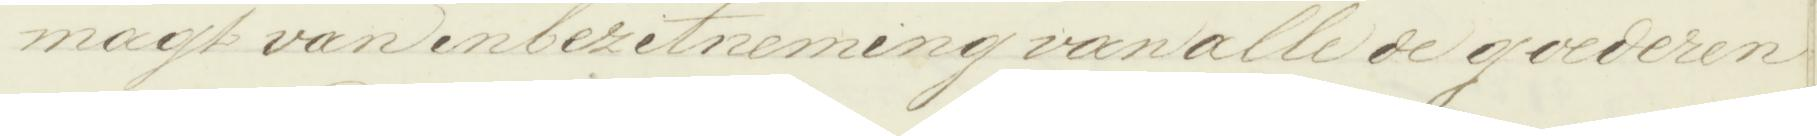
magt van inbezitneming van alle de goederen
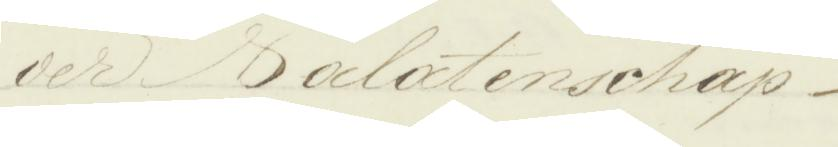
der Nalatenschap-
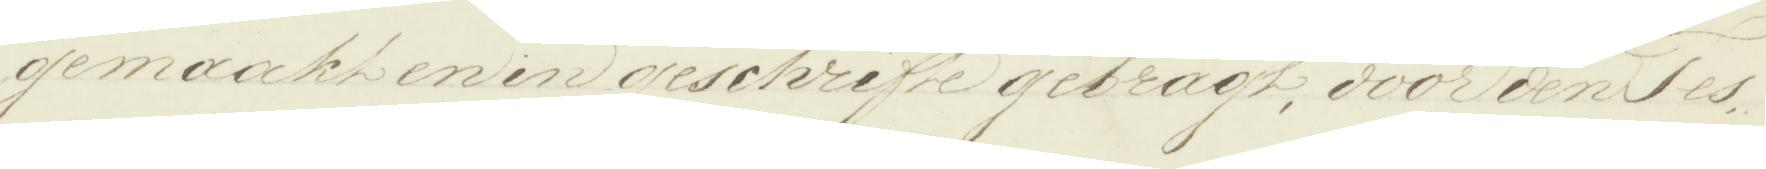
gemaakt en in geschrifte gebragt, door den Tes„
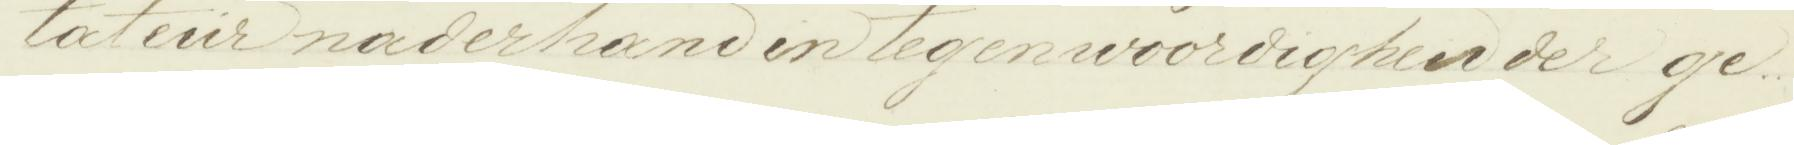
tateur naderhand in tegenwoordigheid der ge„
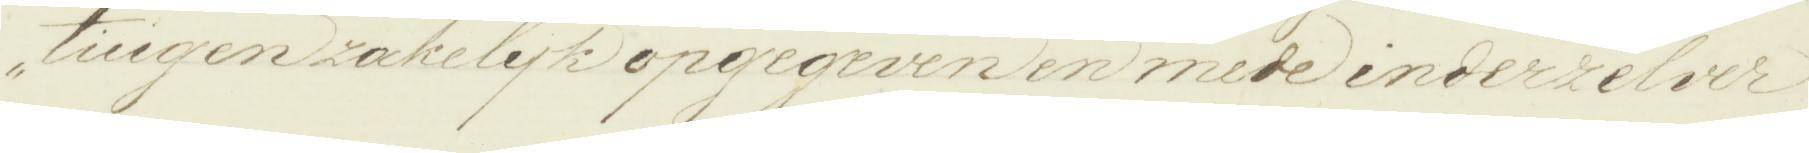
„tuigen zakelijk opgegeven en mede inderzelver
